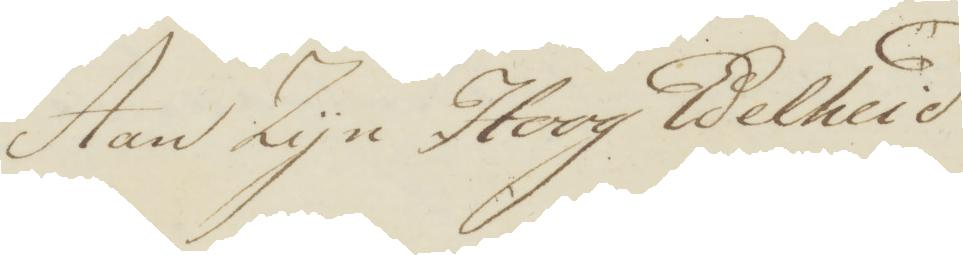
Aan Zijn Hoog Edelheid
